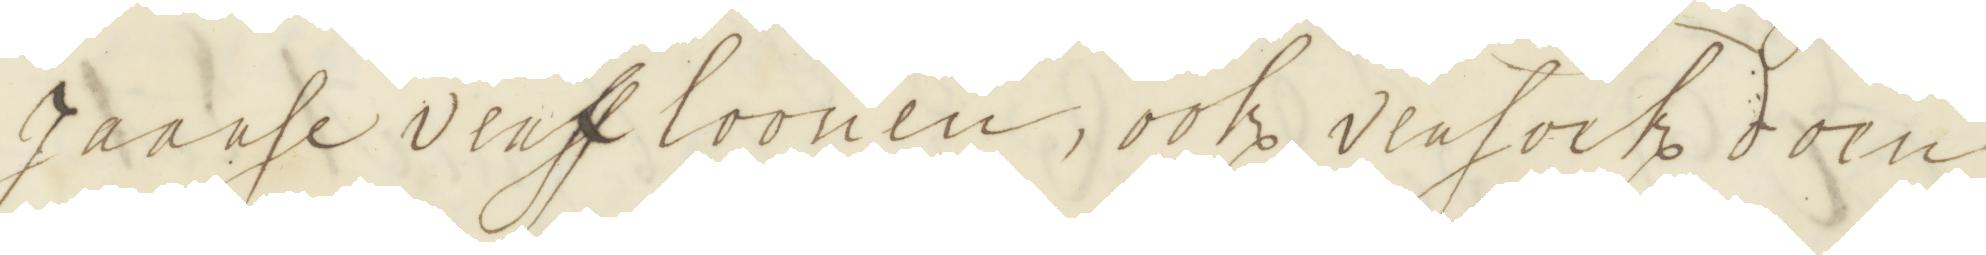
Jaarse verffloonen, ook versoek doen,
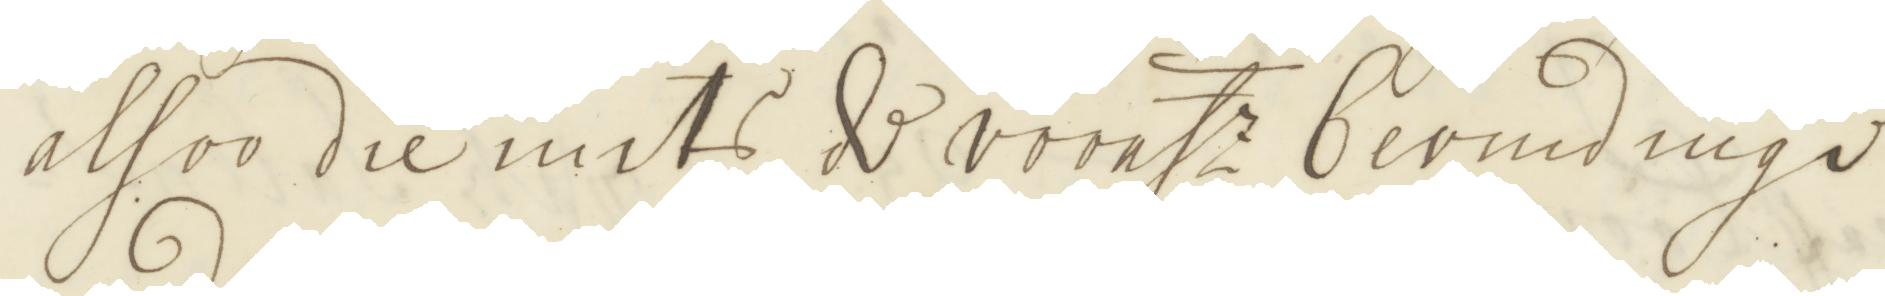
alsoo die mits de voorsz bevindinge
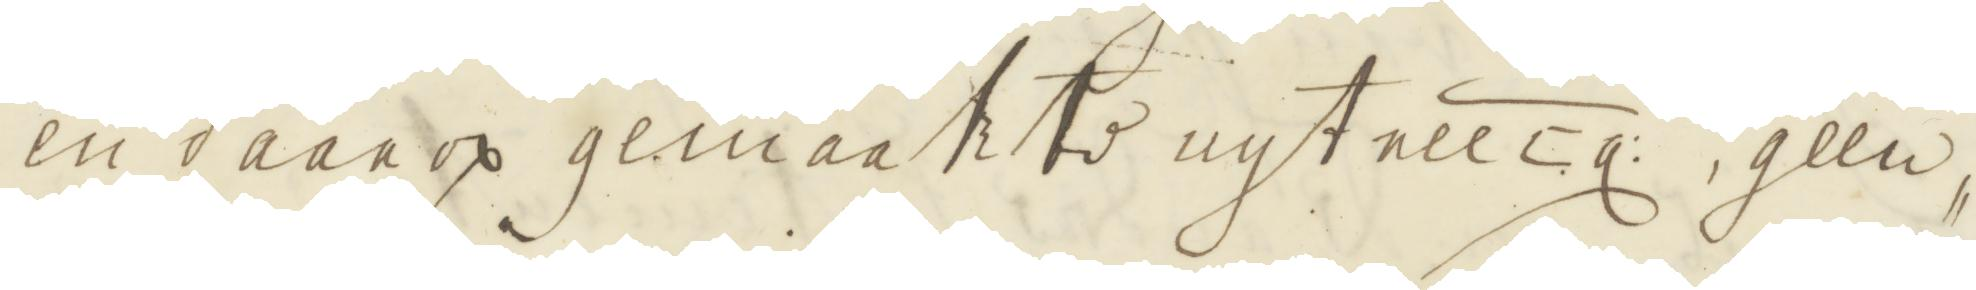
en daar op gemaakte uyt reecq:, geen„
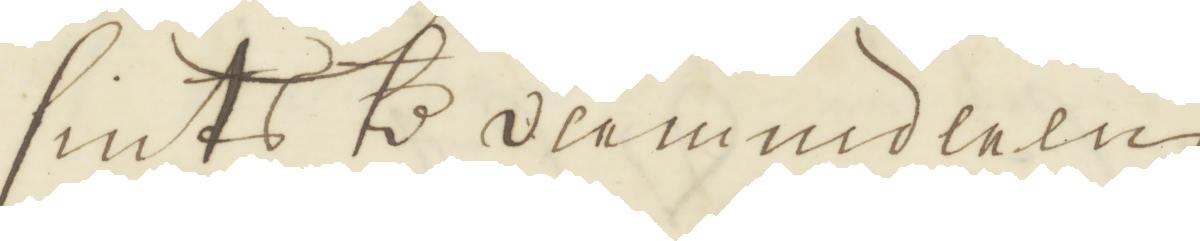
sints te verminderen
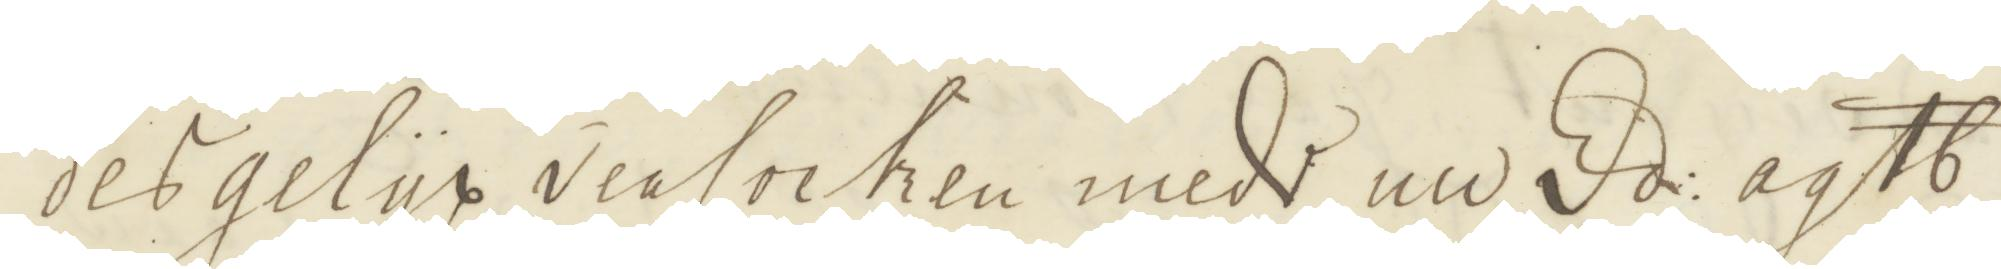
des gelijx versoeken mede uw Ed: agtb
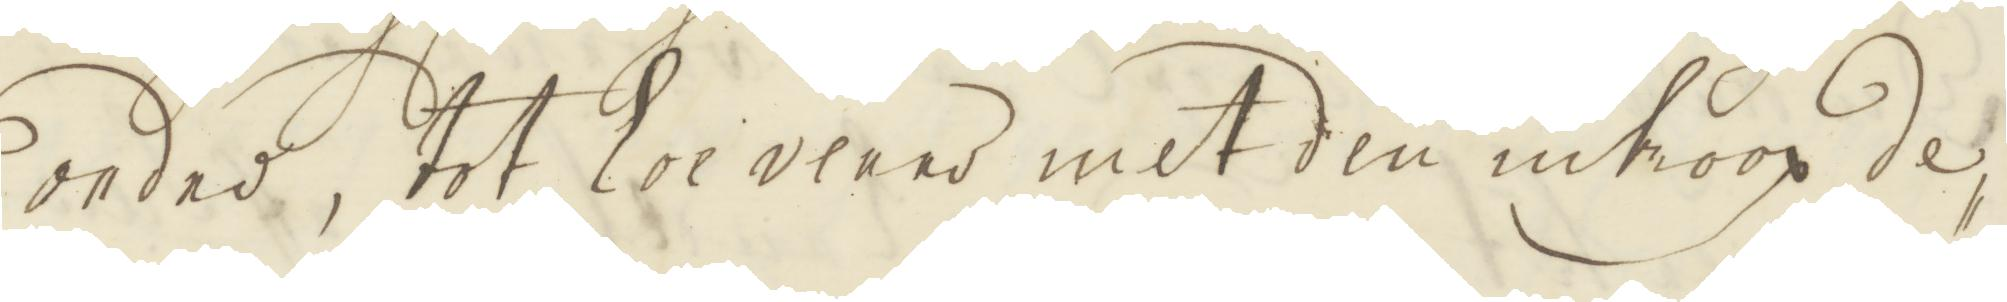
ordre, tot hoe verre met den inkoop de„
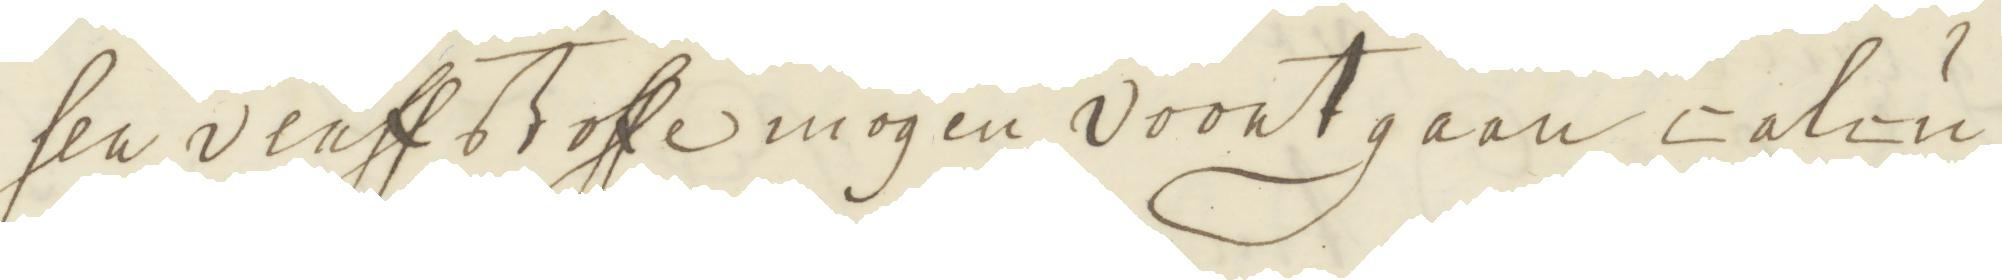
ser verffstoffe mogen voort gaan calcu
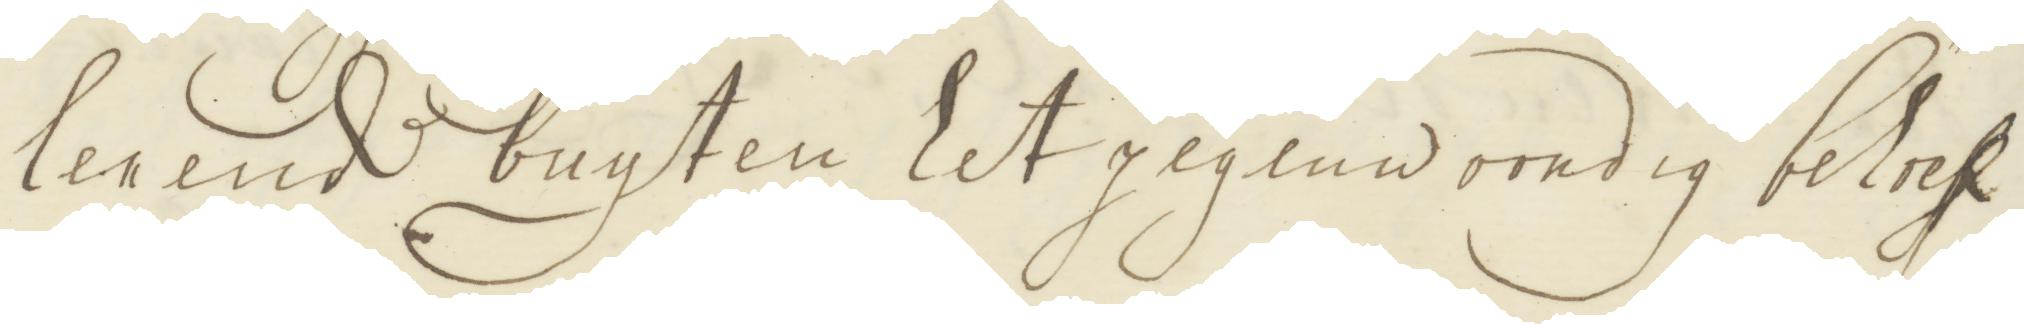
lerende buijten het jegenwoordig behoeff,
